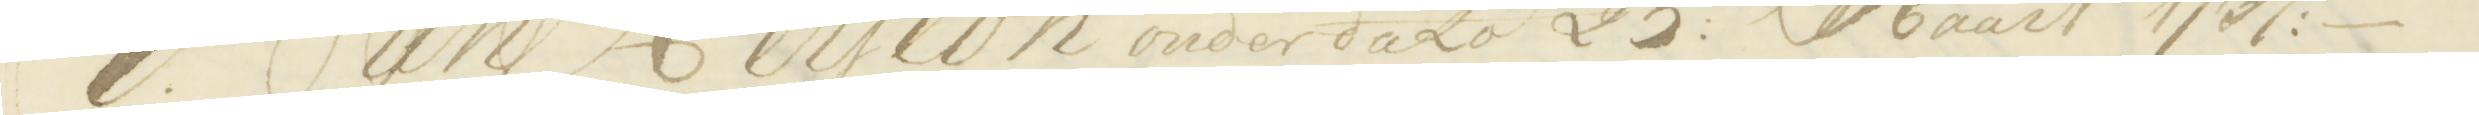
Van Ceijlon onder dato 25: Maart 1737:—
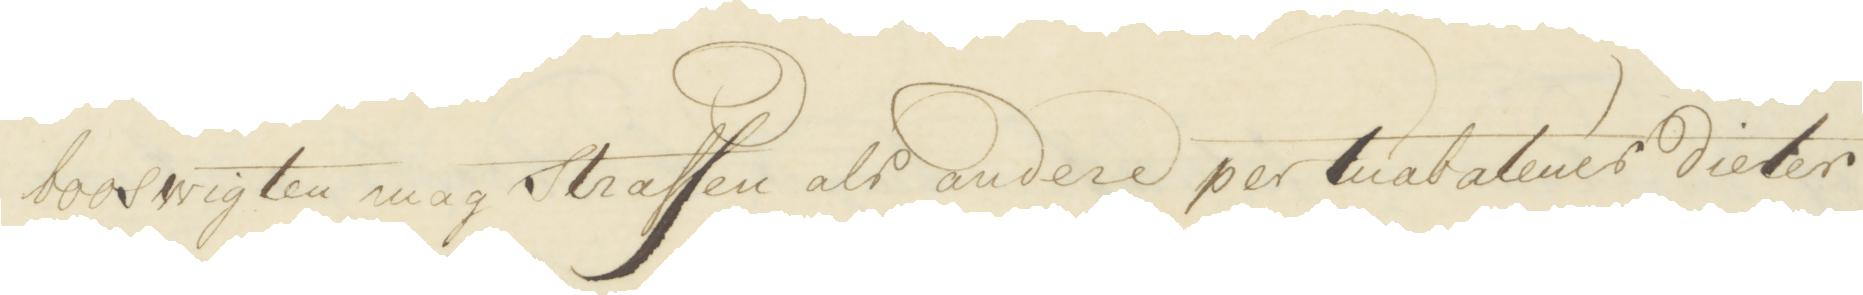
booswigten mag straffen als andere perturbateurs dieter
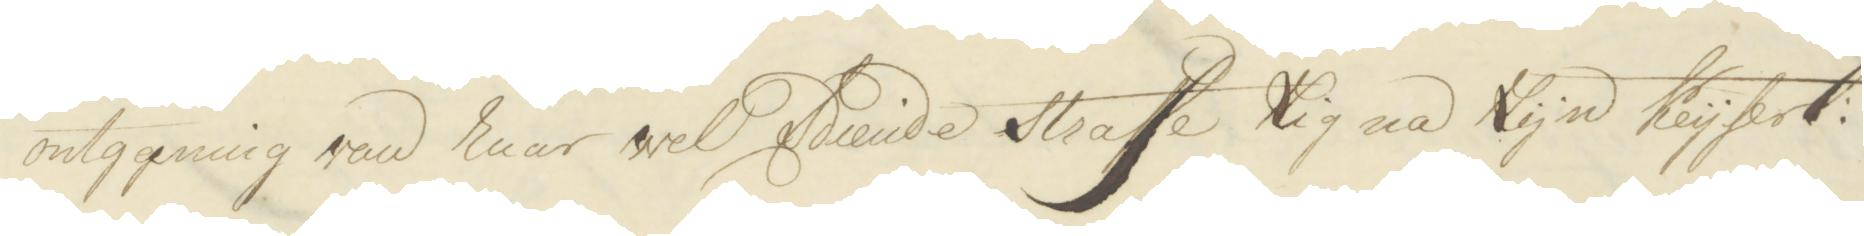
ontggening van haar wel verdiende straffe tig na zijn keijsert:
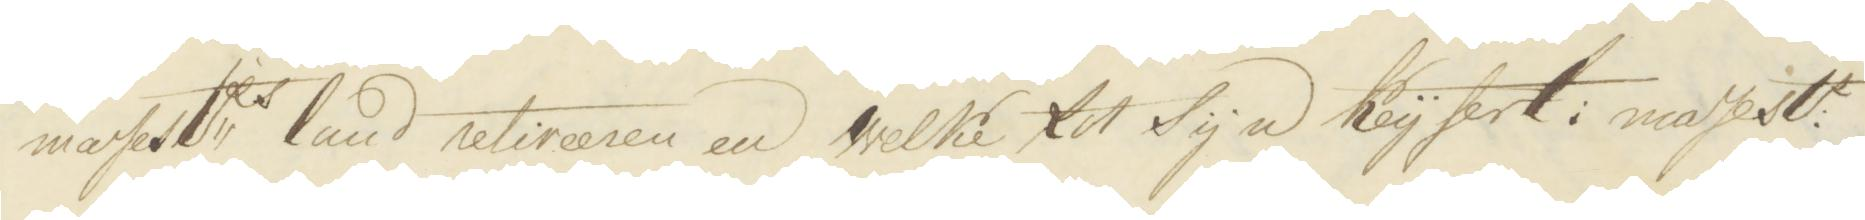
masest„:s land retireeren en welke tot sijn keijsert: majest:
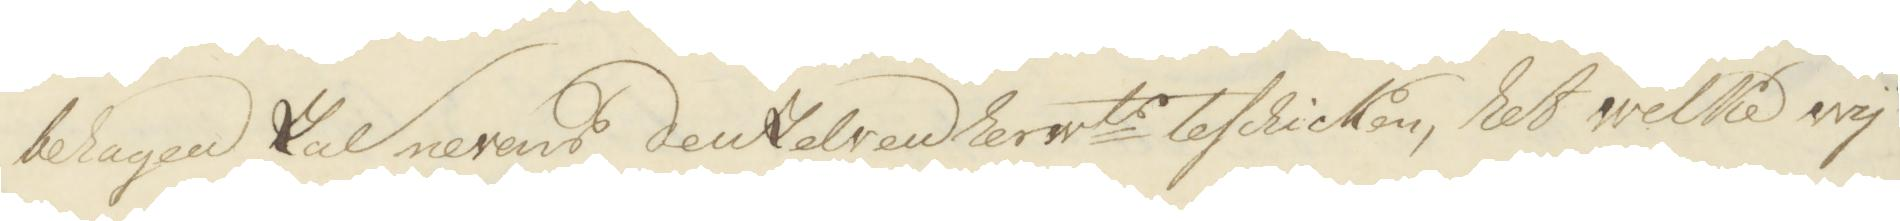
behagen zal nevens denzelven herw=ts teschicken, het welke wij
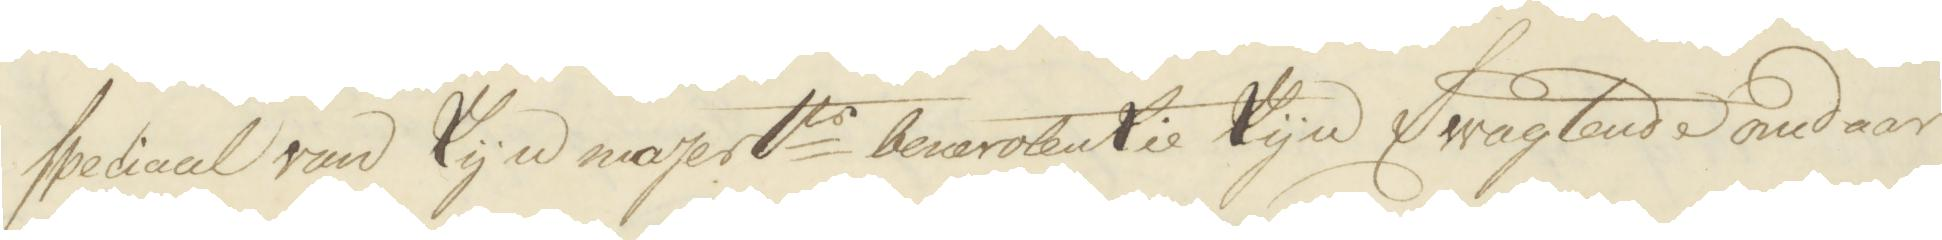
speciaal van zijn majert=ts benevolentie zijn verwagtende omdaar
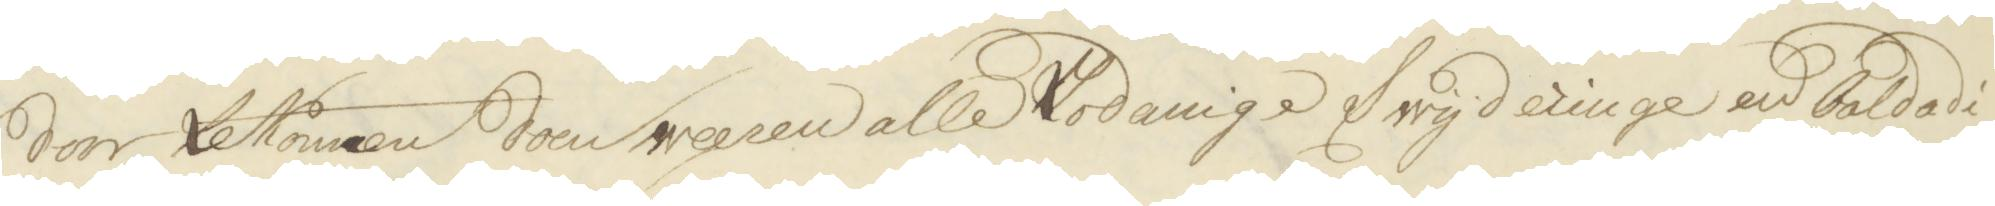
door tekonnen doen weeren alle zodanige verwijderinge en baldadi
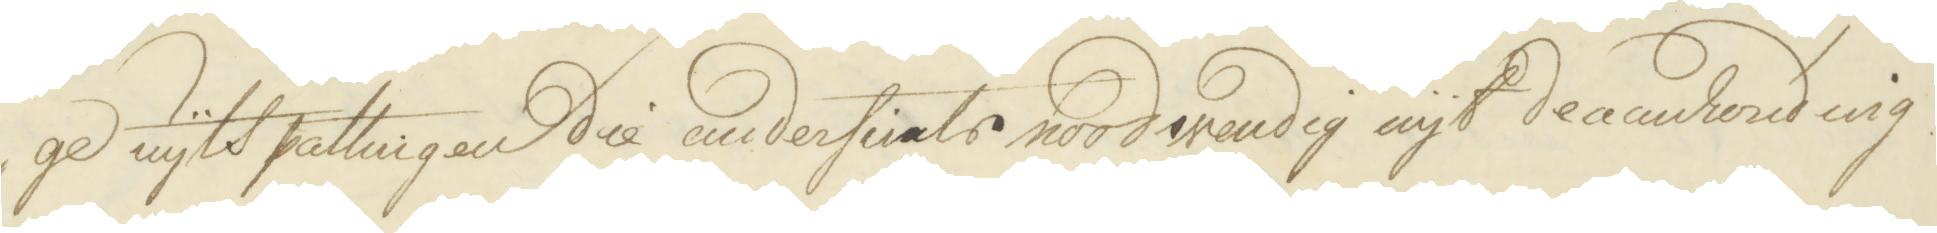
„ge uijtspattingen die andersiats noodwondig uijt de aanhouding.
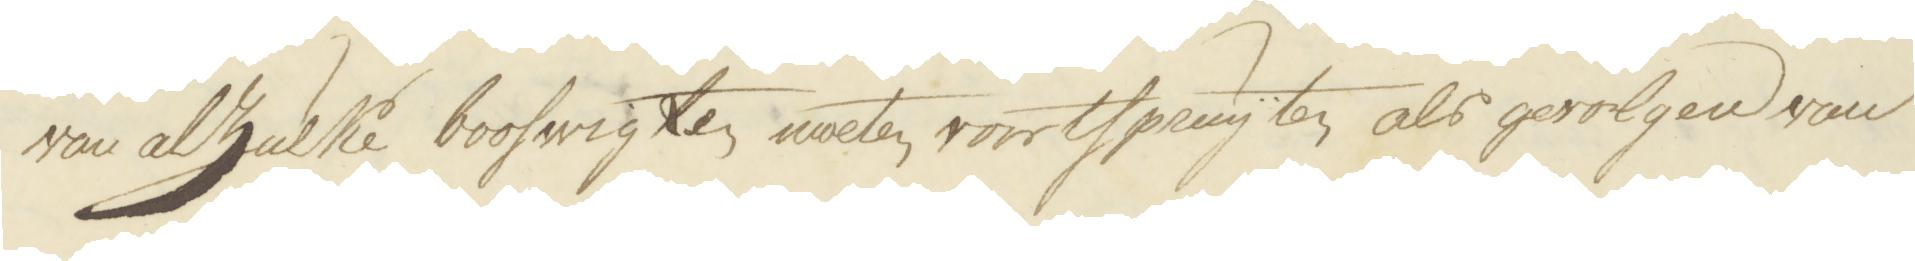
van alzulke booswigten moeten voor'tspruijten als gevolgen van
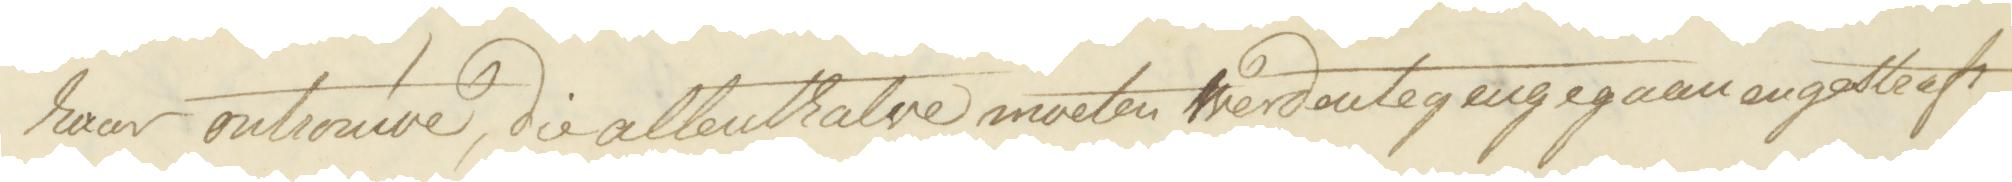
haar ontrouwe, die allenthalve moeten werden tegengegaan en gesteeft
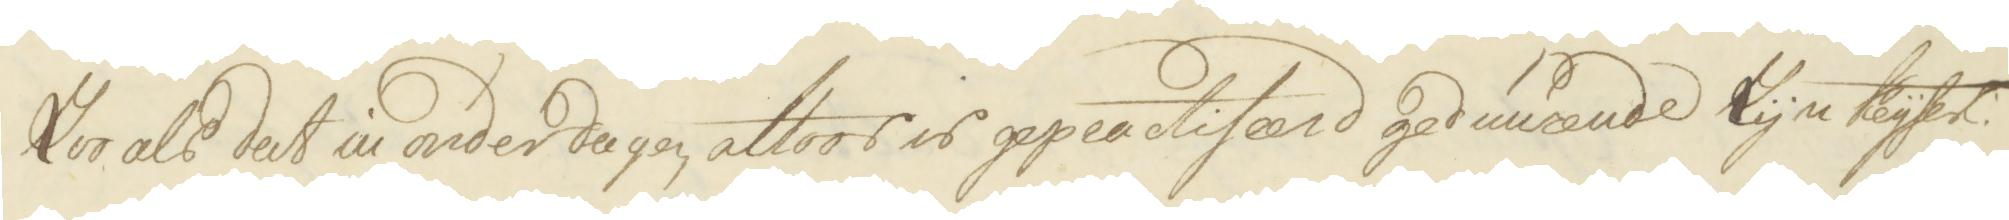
zoo als dat in onder dagen altoos is gepeactiseerd geduurende zijn kijserl:
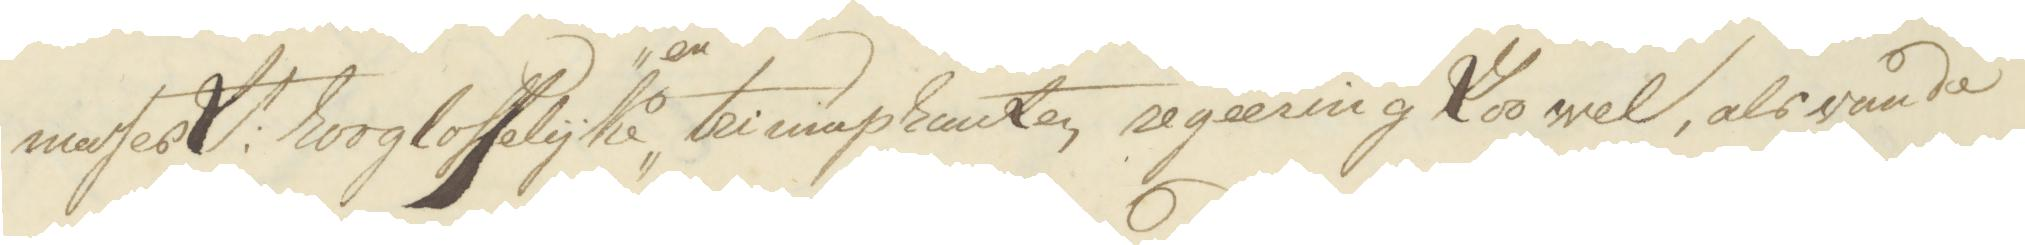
majest:t hooghoffelijke, te uaphenten regeering zoo wel, als van de
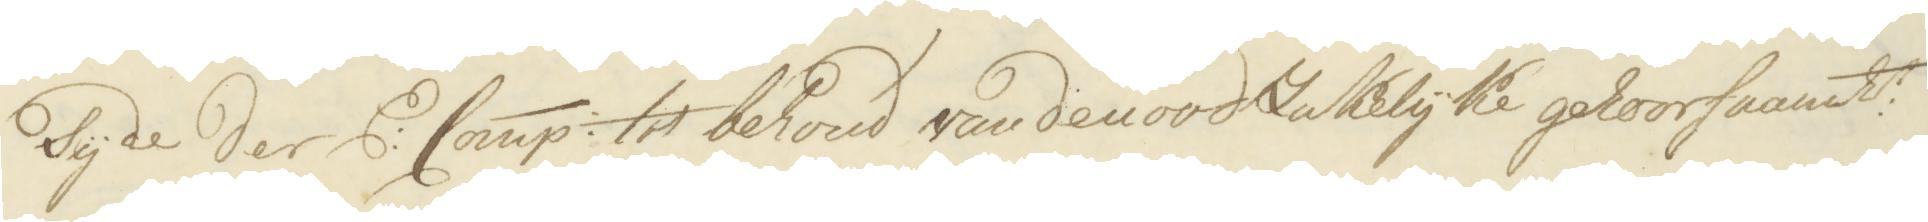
sijde der E: Comp:e tot behoud van denoodzakelijke gehoorsaamt:
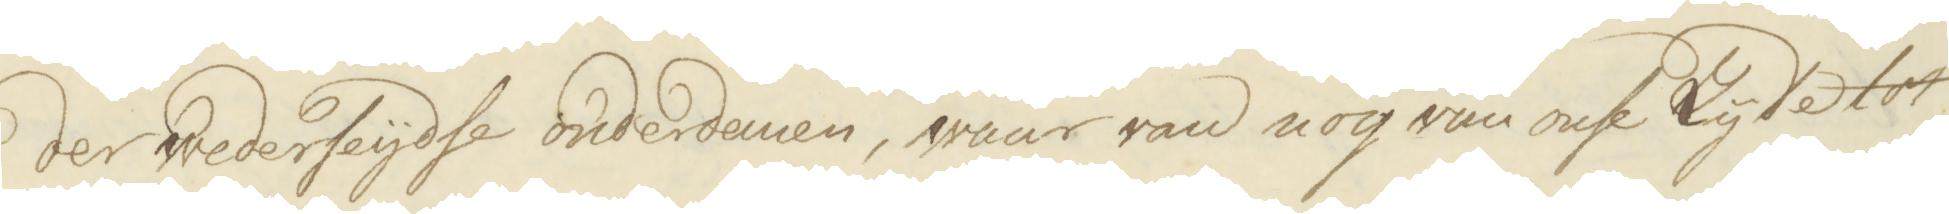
der wederseijdse onderdanen, waar van nog van onse zijde tot
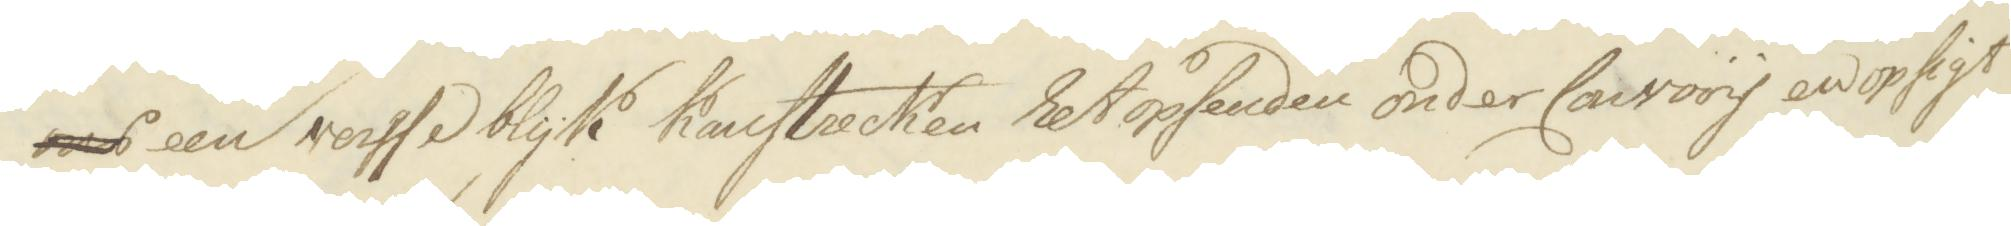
ons een vorsse blijk kanstrecken het opsenden onder Convoij en op sigt
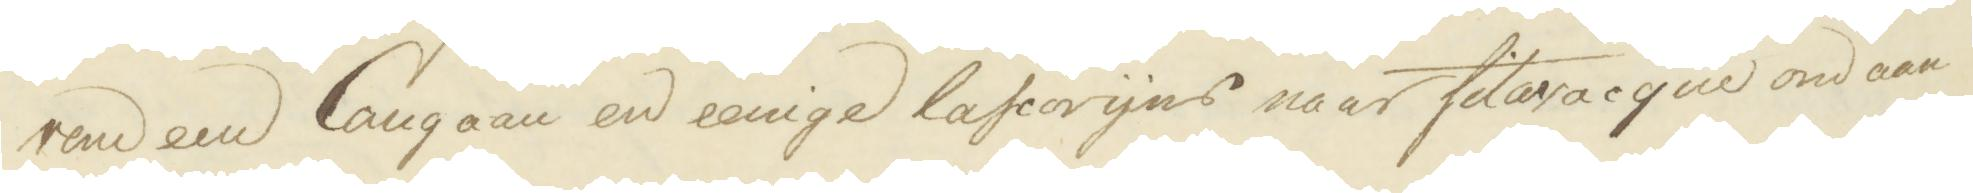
vam een Cangaan en eenige lascorijns naar fetavacque omdaar
